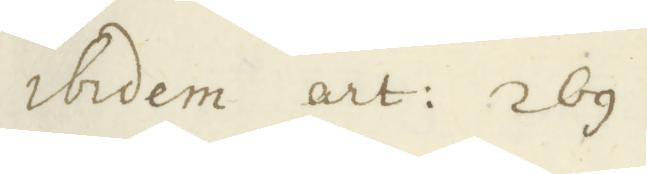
ibidem art: 269
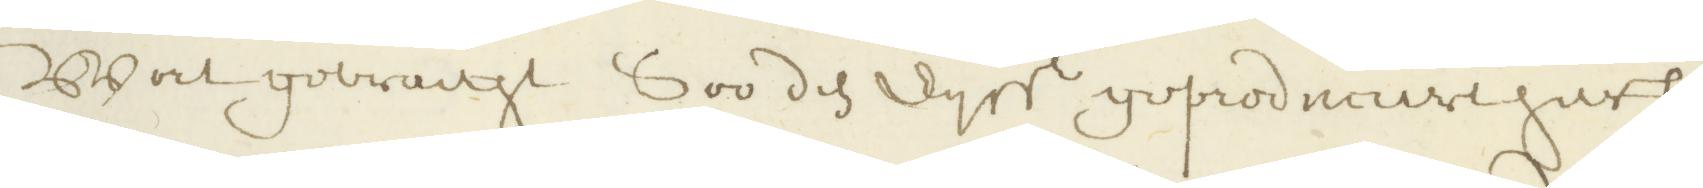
wort gevraecht soo des Eyssr geproduceert heeft
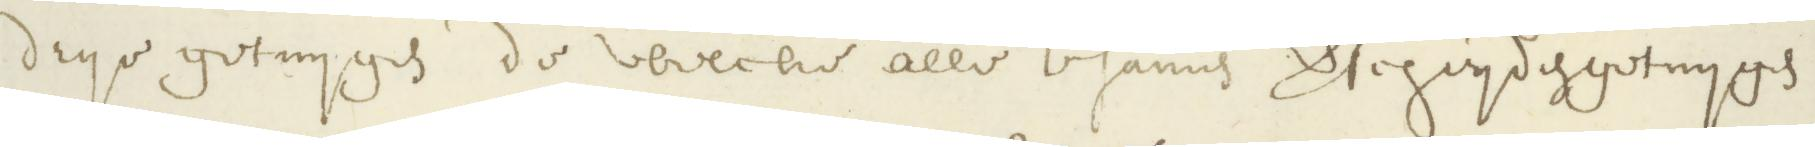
drye getuygen de welcke alle tesamen verscheyden getuygen
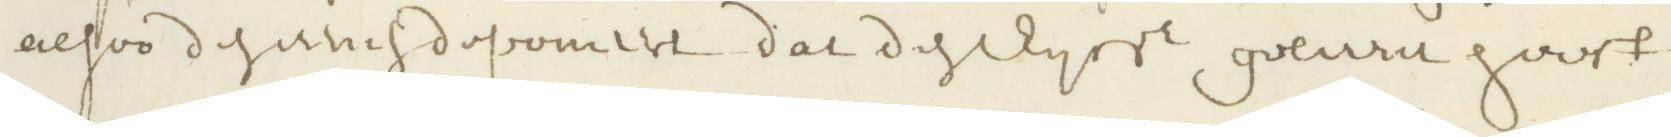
alsoo den eenen deponeert dat de Eyssr geleent heeft
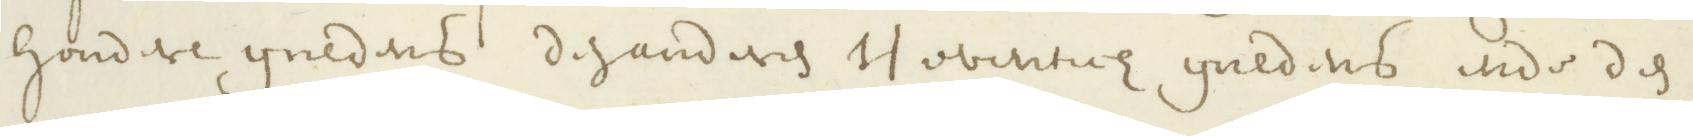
hondert guldens den anderen tseventich guldens ende den
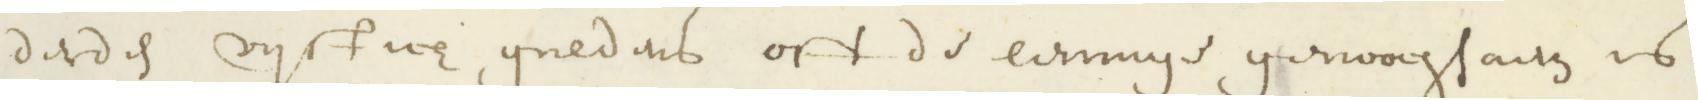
derden vyftich guldens off de leninge genoochtsaem is
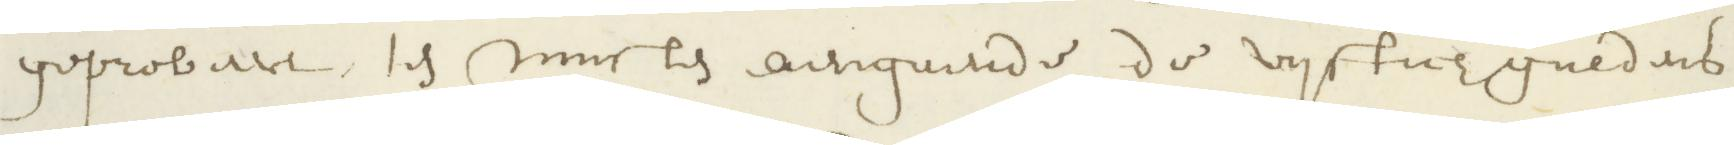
geprobeert, ten minsten aengeende de vyftich guldens
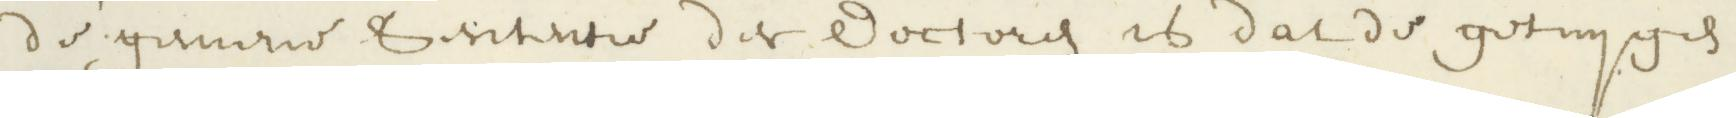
de gemene sententie der doctoren is dat de getuygen
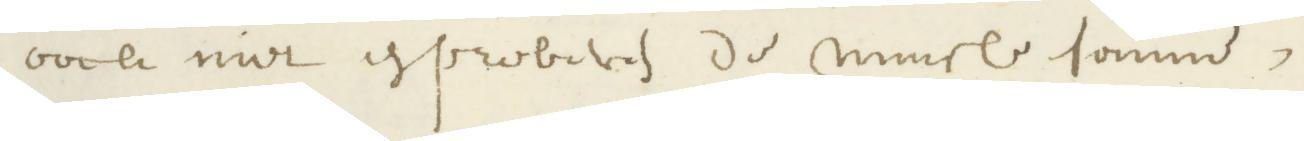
oock niet en proberen de minste somme
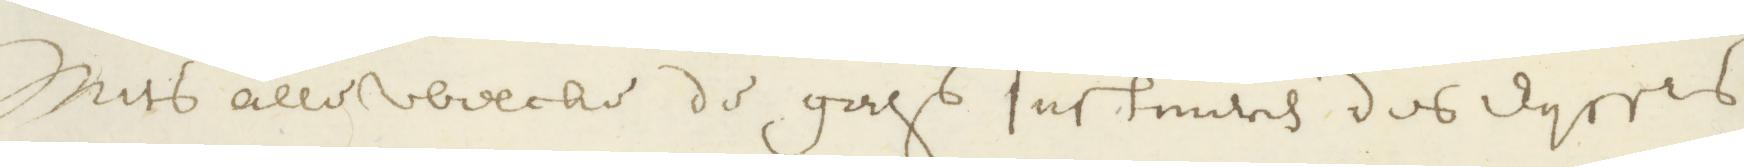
Mits alle welcke de geds sustineren des Eyssrs
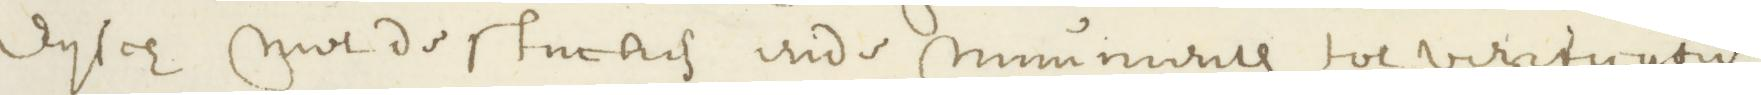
Eysch met de stucken ende munimenten tot verificatie
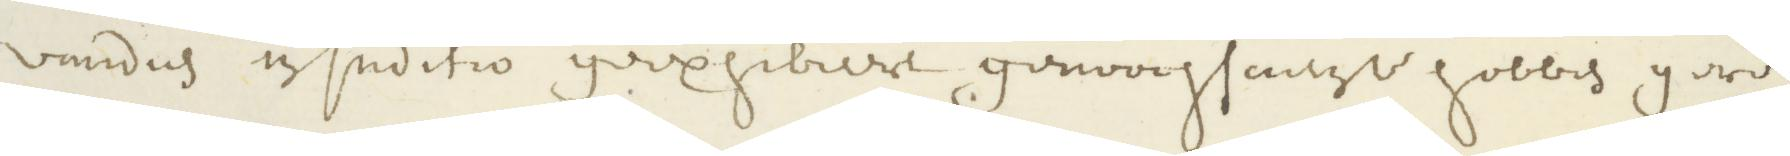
van dien in jnditie geexhibeert genoochsaem te hebben gere
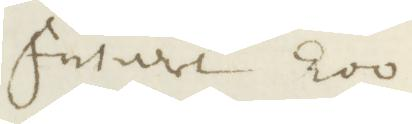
futeert zoo,
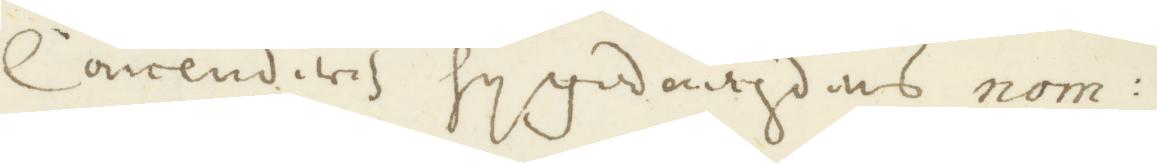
Concludeert hy gedaechdens nom :
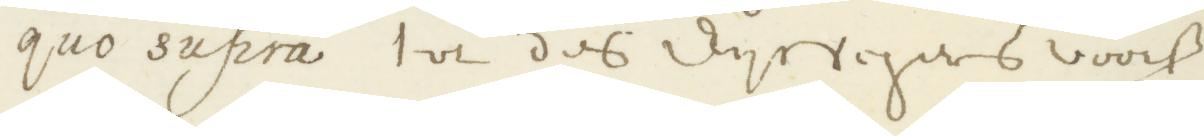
quo supra tot des Eysschers voorsz
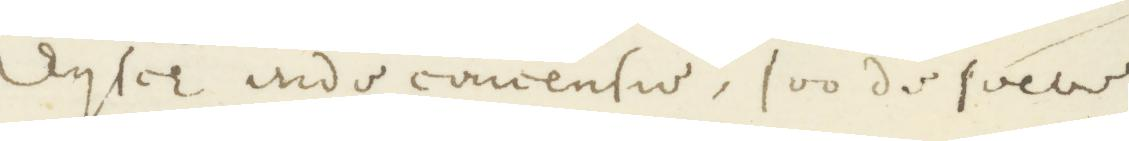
Eysch ende conclusie, soo de selve
